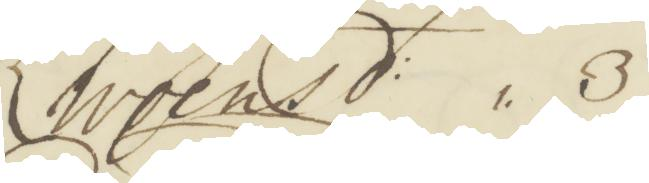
woensd: „ 3
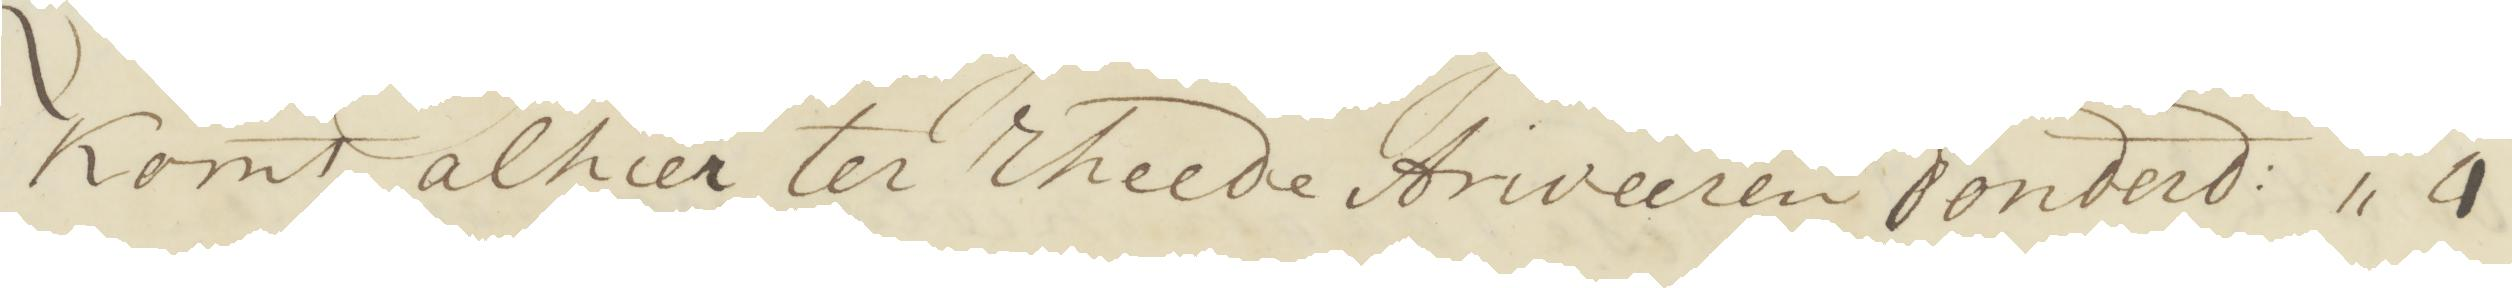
Komt alhier ter rheede Ariveeren donderd: „ 4
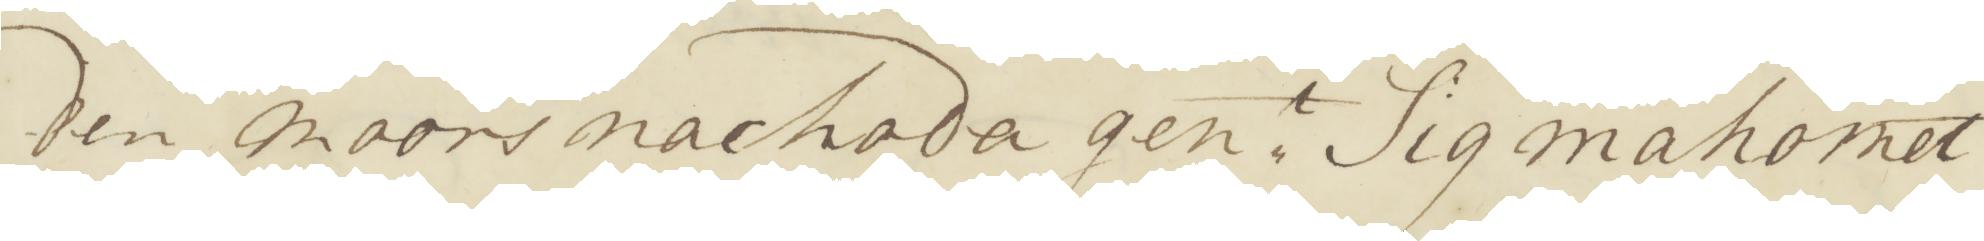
den moors nachoda gen„t sig mahomet
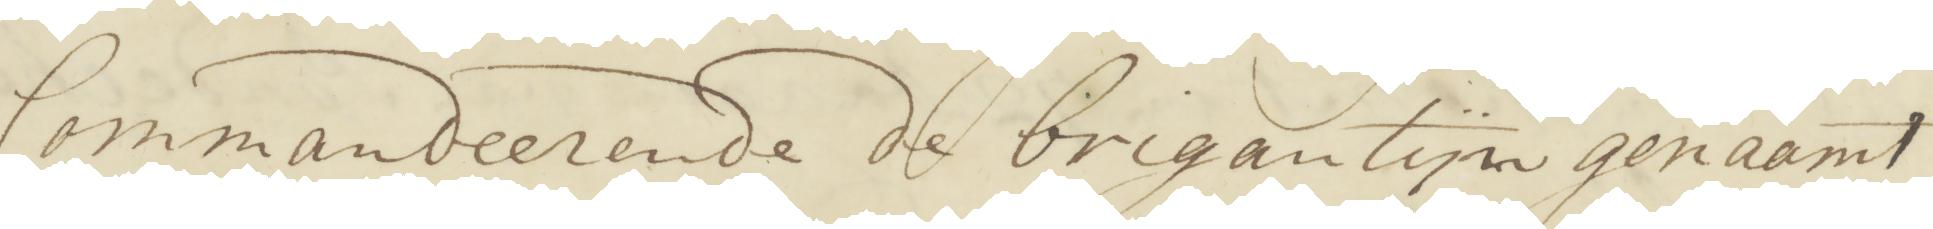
Commandeerende de brigantijn genaamt
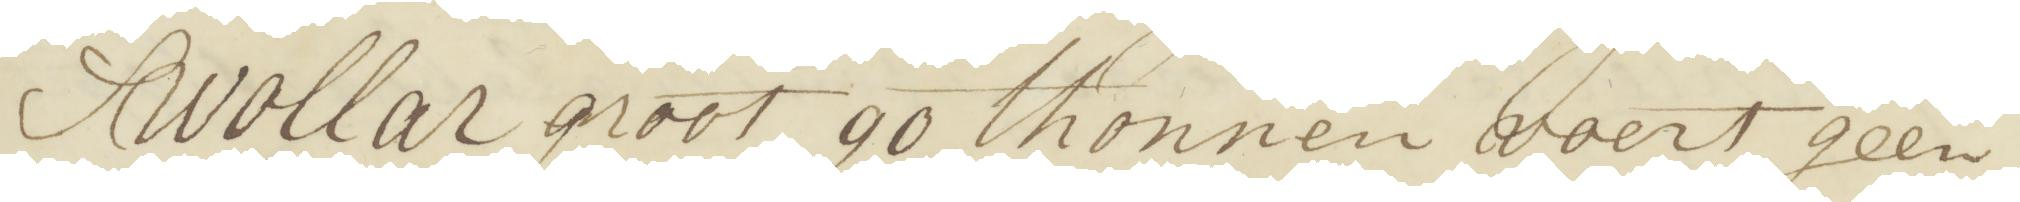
Swollar groot 90 thonnen voert geen
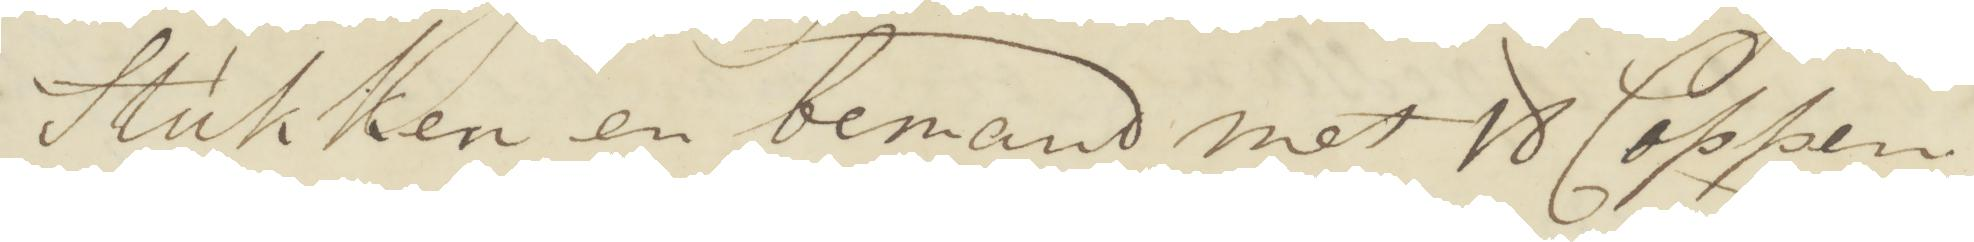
stukken en bemand met 18 Coppen
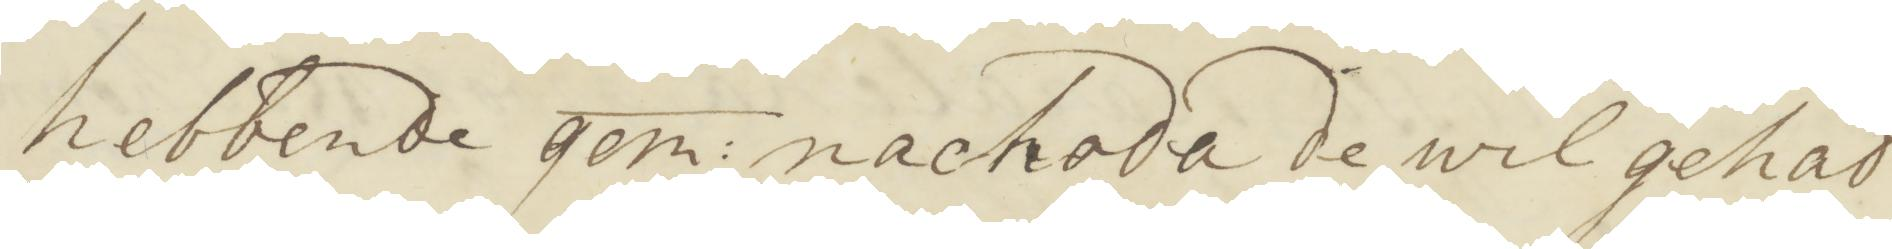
hebbende gem: nachoda de wil gehad
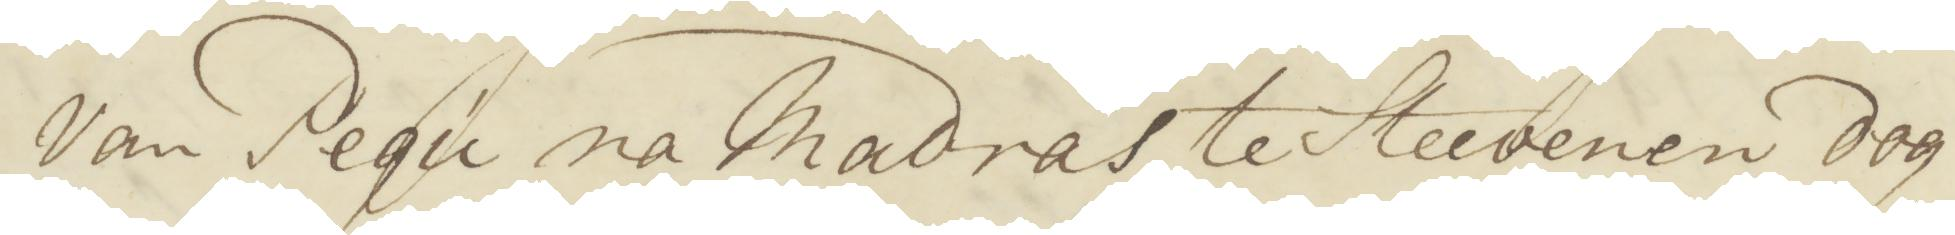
van Pegu na Madras te steevenen dog
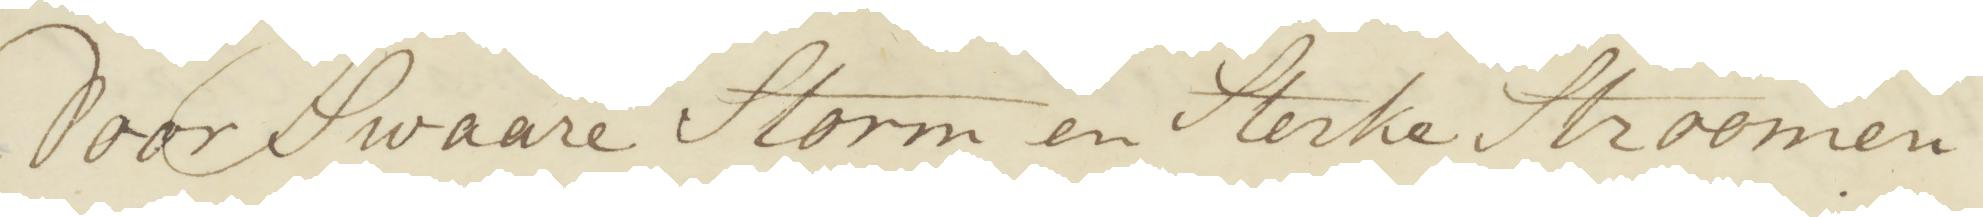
door swaare storm en sterke stroomen
